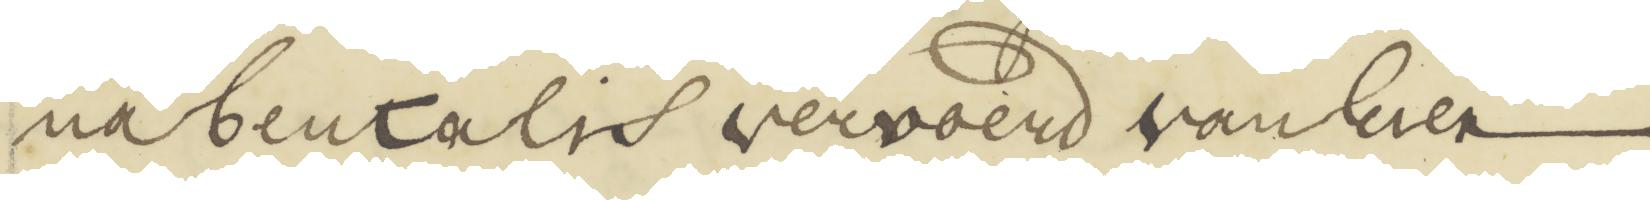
na bencalis vervoerd van hier
